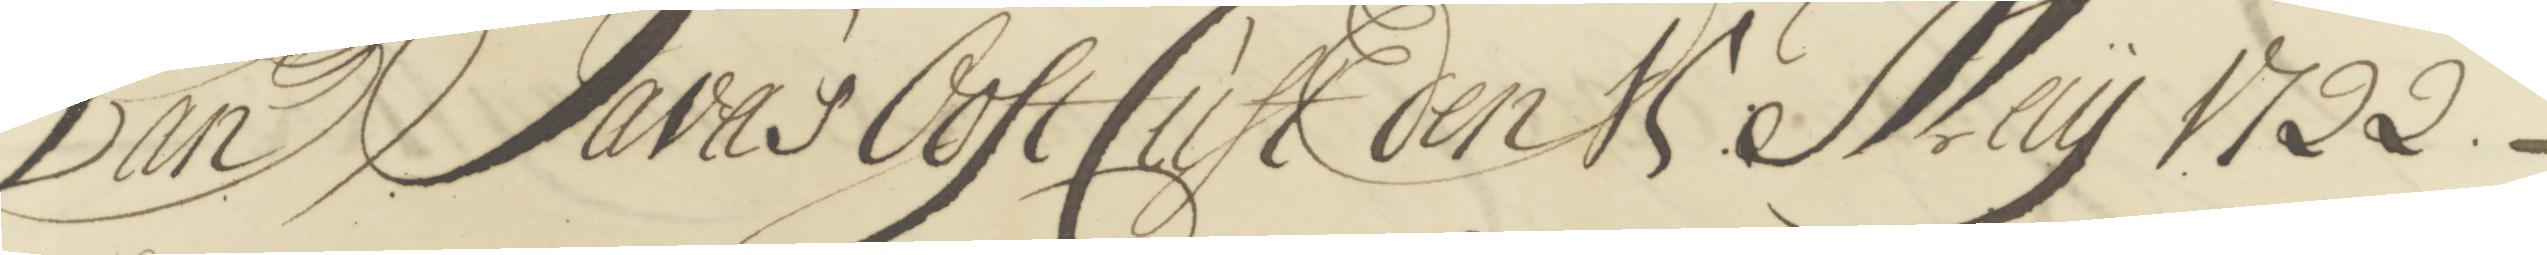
Van Java's Oost Cust den 15:' Meij 1722. —
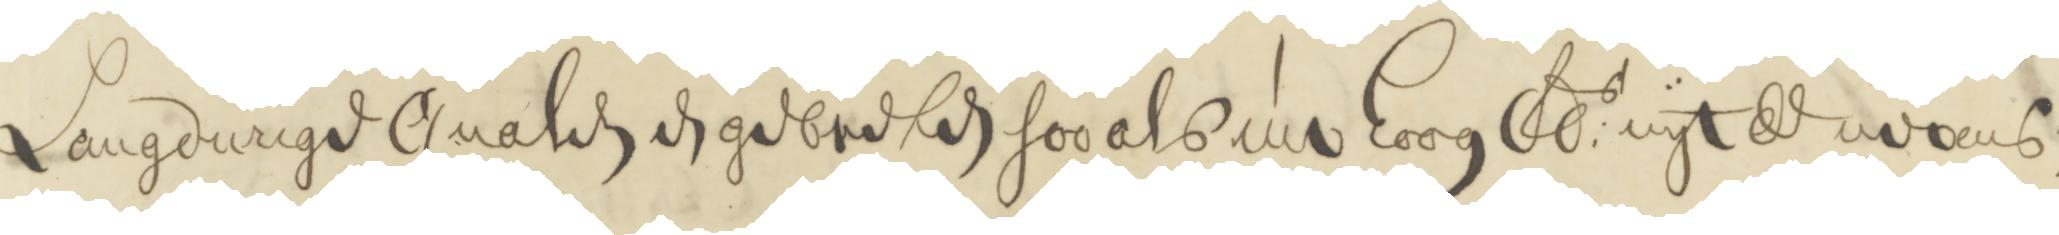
Langdurige qualen en gebreken soo als uw hoog Ed:s uijt de nevens
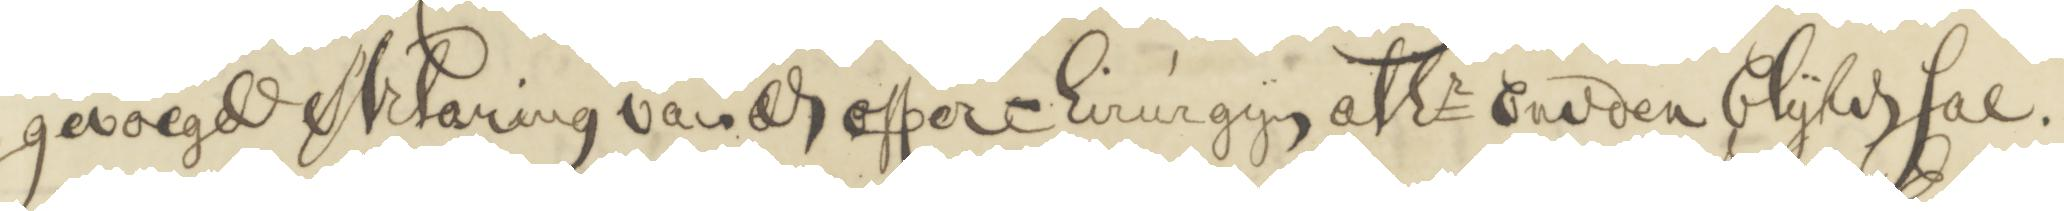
gevoegde verklaring van den opperchirurgijn alh=r breder blijken sal.
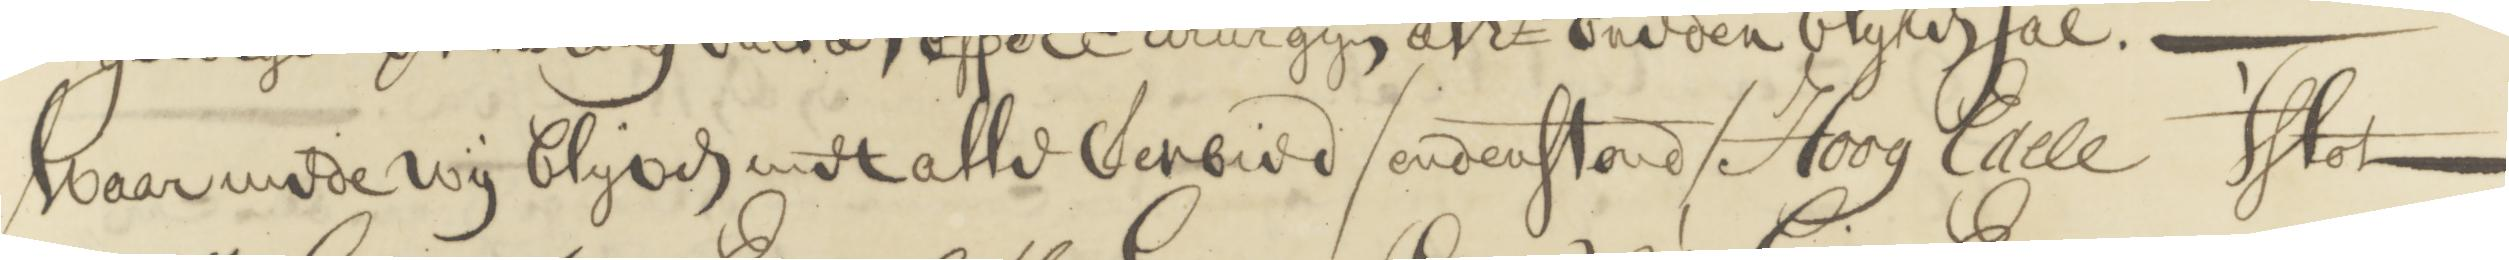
Waarmede wij blijven met alle Eerbied /onder stond / Hoog Edele 't Slot.
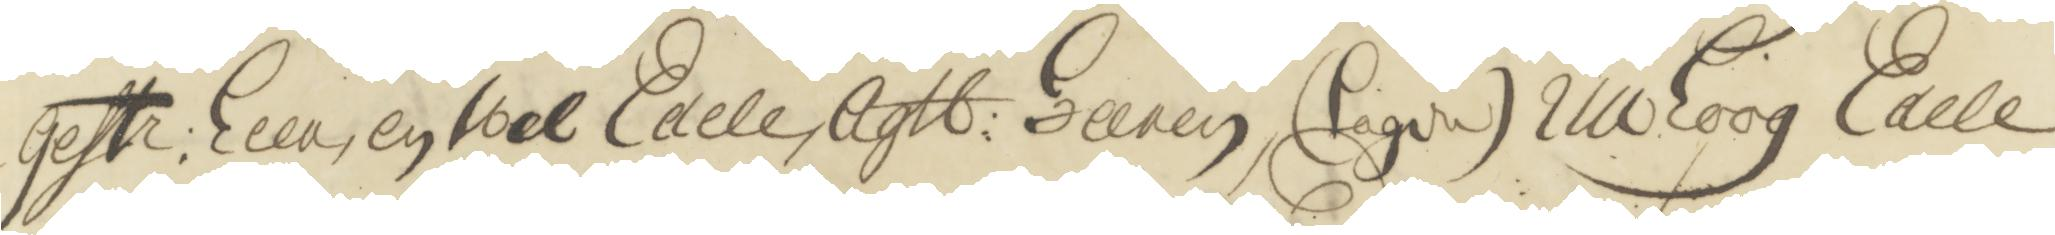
gestr: heer, en wel Edele, agtb: heeren, (lager) uw hoog Edele
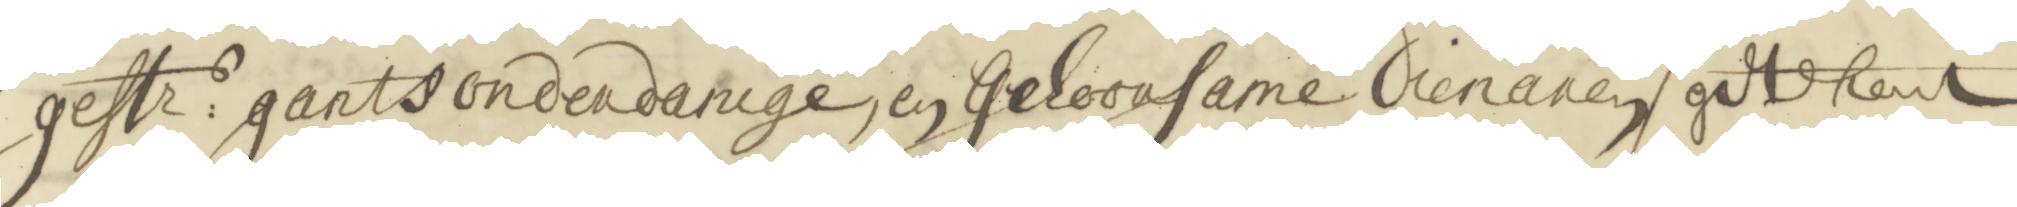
gestr:e gants onderdanige, en gehoorsame dienaren /getekent
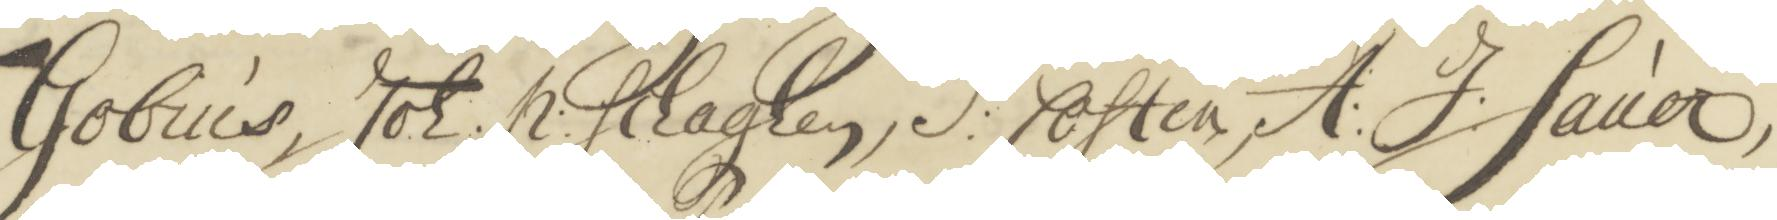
Gobius, Joh: p: Schaghen, T:s Coster, A: I: Sauer,
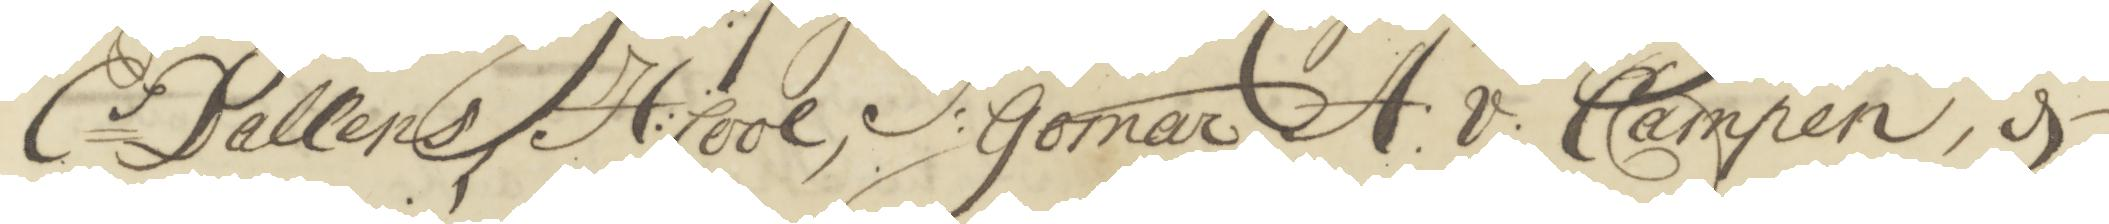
E=s Dallens, H: Cool, P: Gomar, A: v: Campen, en
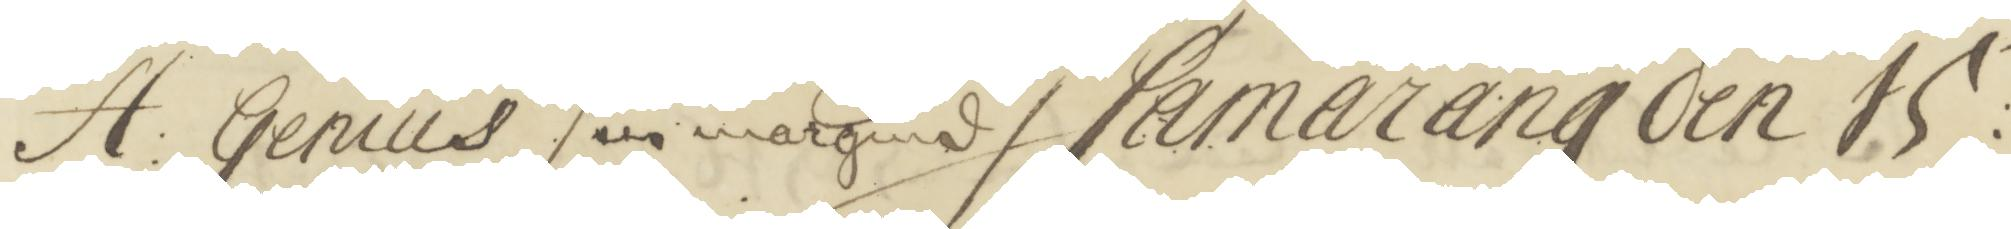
A: Genius / in margine/ Samarang den 15:
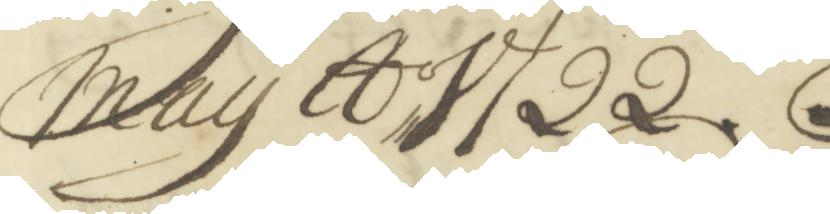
maij A„o 1722.
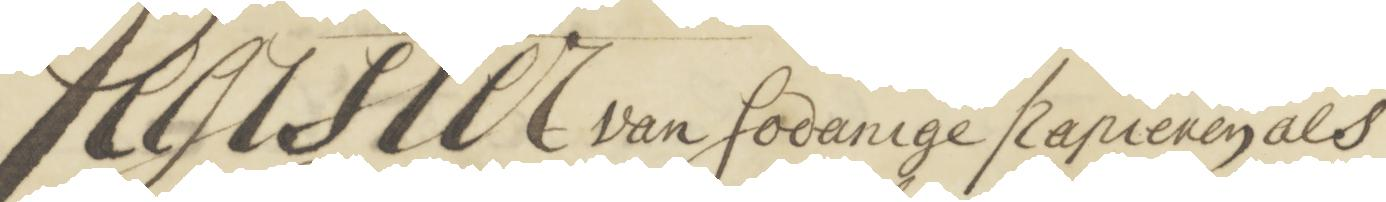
Register van sodanige papieren als
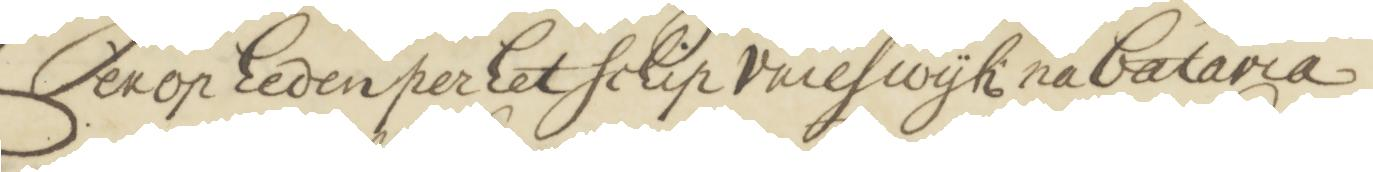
er op heden per het schip vrieswijk na batavia
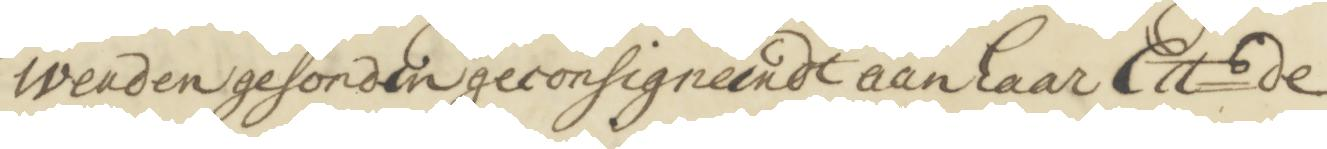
werden gesonden geconsigneerdt aan haar Ed=s de
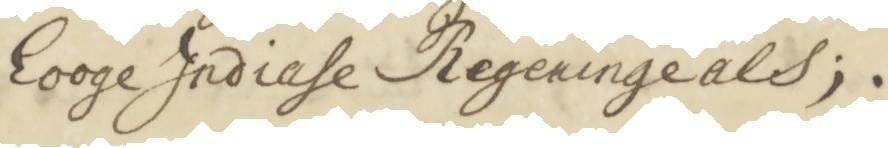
hooge Jndiase Regeringe als;.
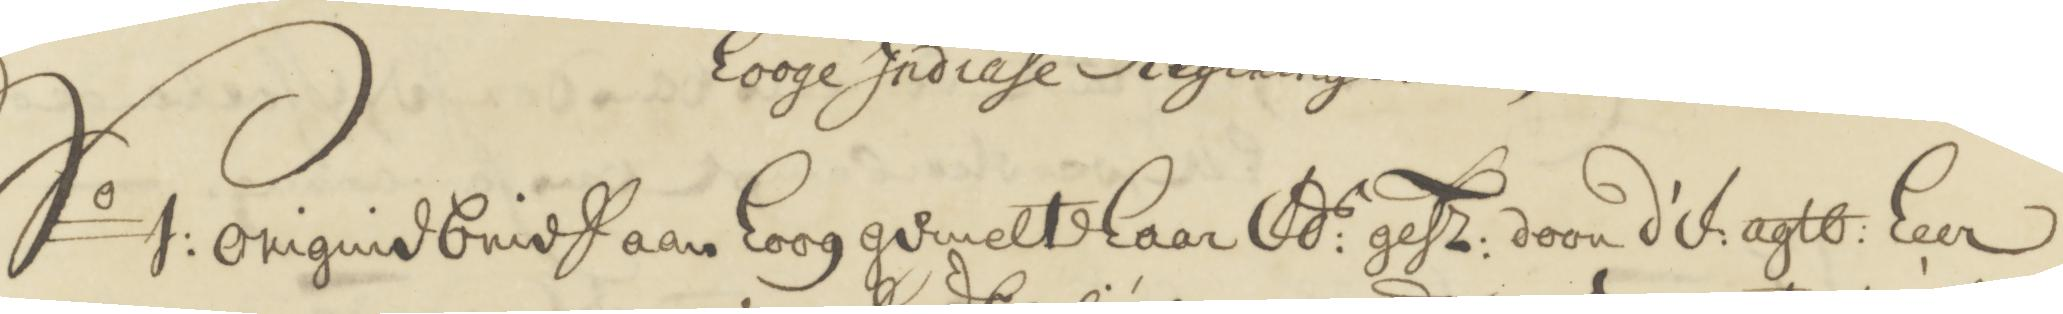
N=o 1: origine brief aan hoog gemelte haar Ed:s gesz: door d’E: agtb: heer
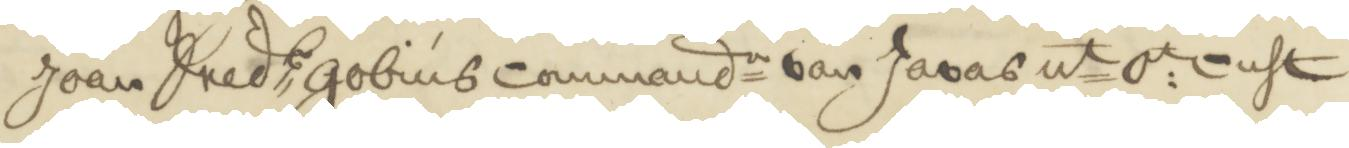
joan fred„k gobius command=r van Javas n=t o:t cust
